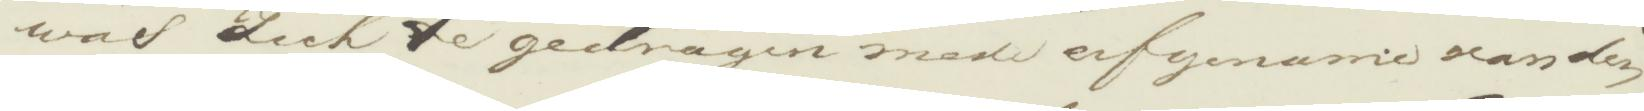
was zich te gedragen mede erfgename van den
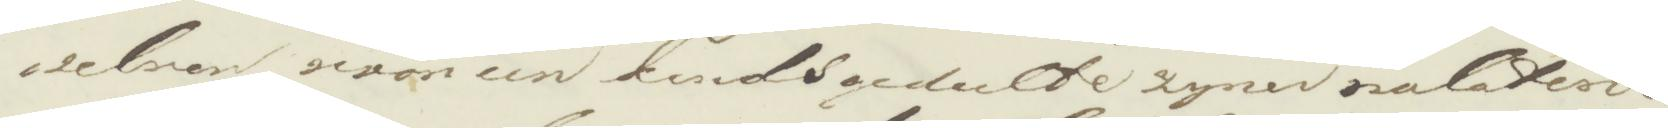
zelven voor een kindsgedeelte zyner nalaten-
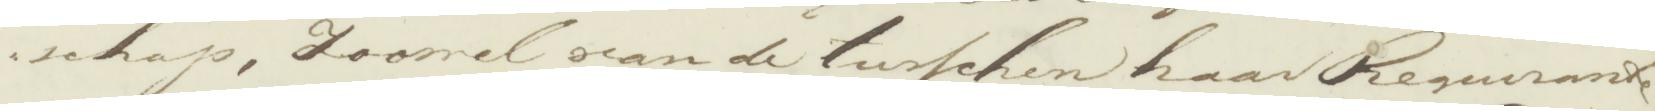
„schap, zoowel van de tusschen haar Requiranten
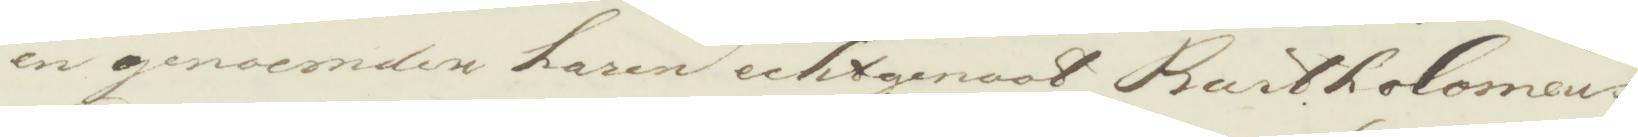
en genoemden haren echtgenoot Bartholomeus
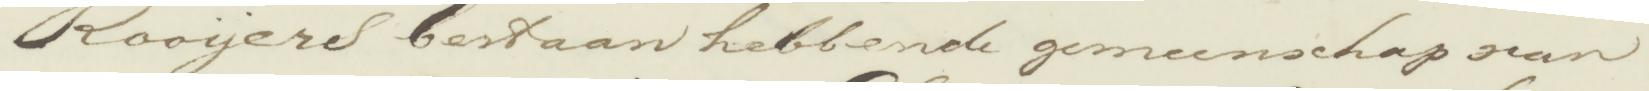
Rooijers bestaan hebbende gemeenschap van
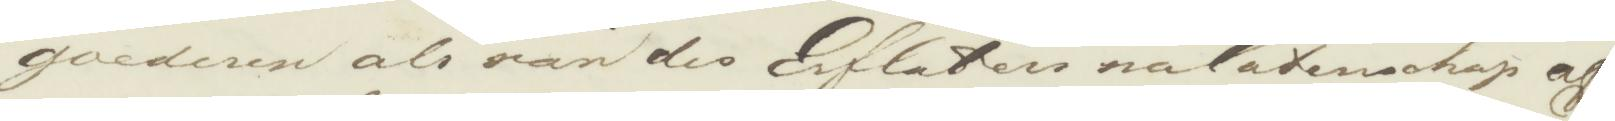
goederen als van des Erflaten nalatenschap af
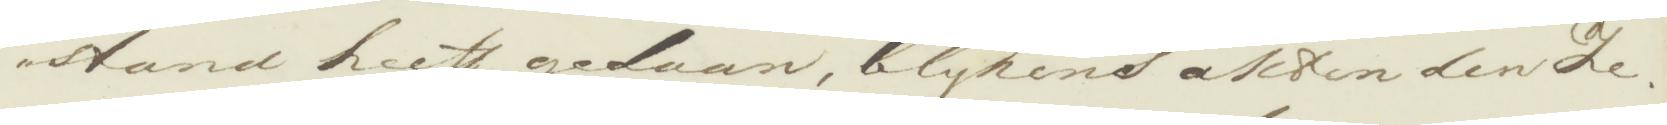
„stand heeft gedaan, blykens akten den Ze.
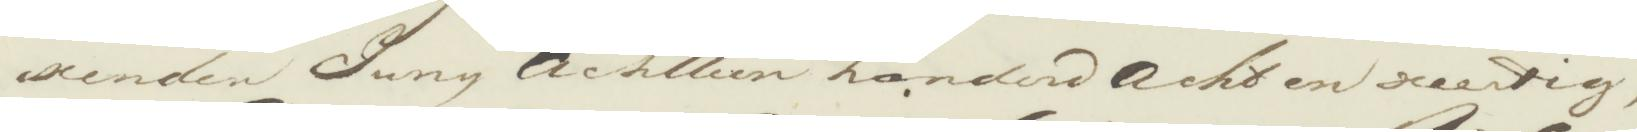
,venden Iuny Achttien honderd Acht en veertig
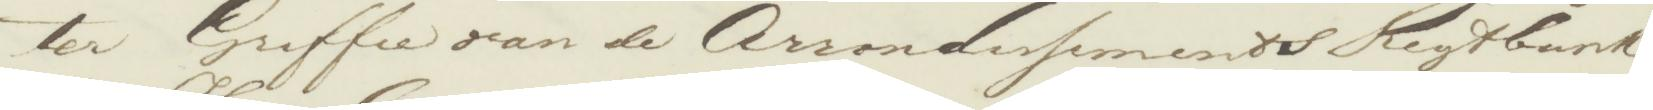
ter Griffie van de Arrondissements Regtbank
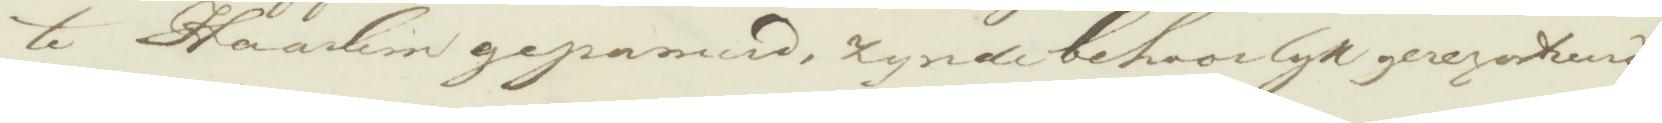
te Haarlem gepasseerd, zynde behoorlyk geregistreerd
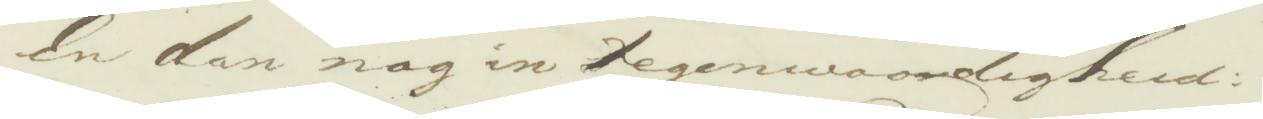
En dan nog in tegenwoordigheid:
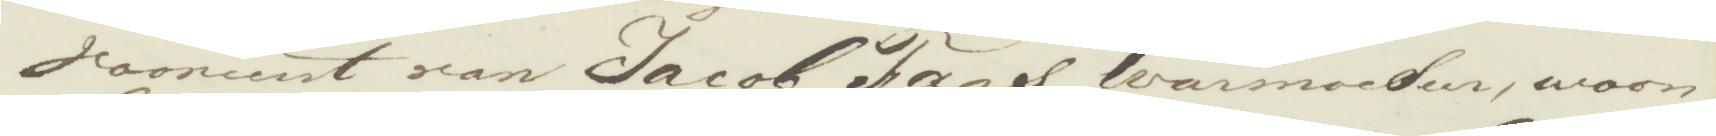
vooreerst van Jacob Faas warmoesier, woon
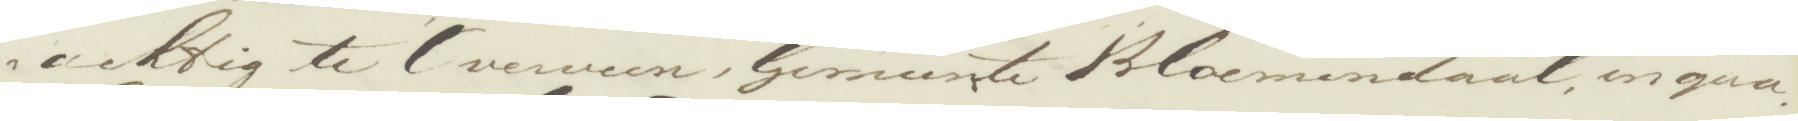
achtig te Overveen, Gemeente Bloemendaal, en qua
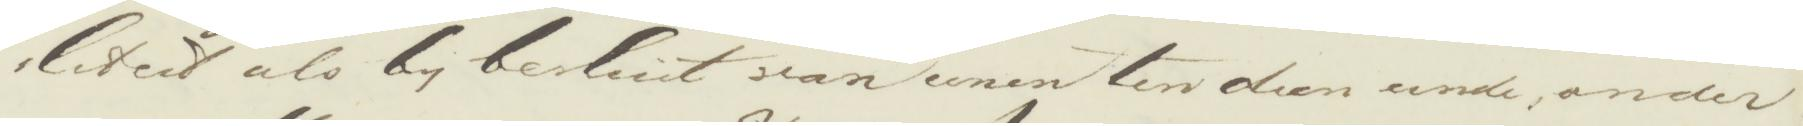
„liteit als bij besluit van eenen ten dien einde, onder
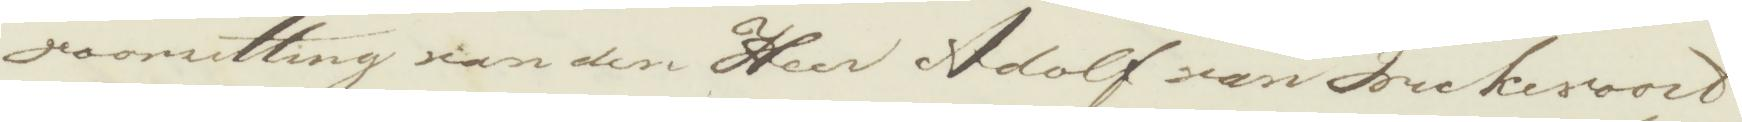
voorzitting van den Heer Adolf van Wickevoort
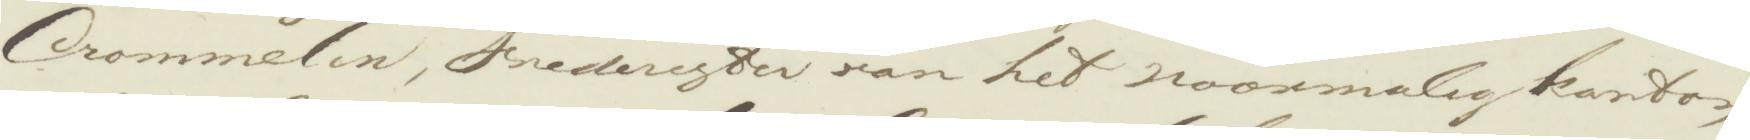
Crommelin, Vrederegter van het voormalig kanton
